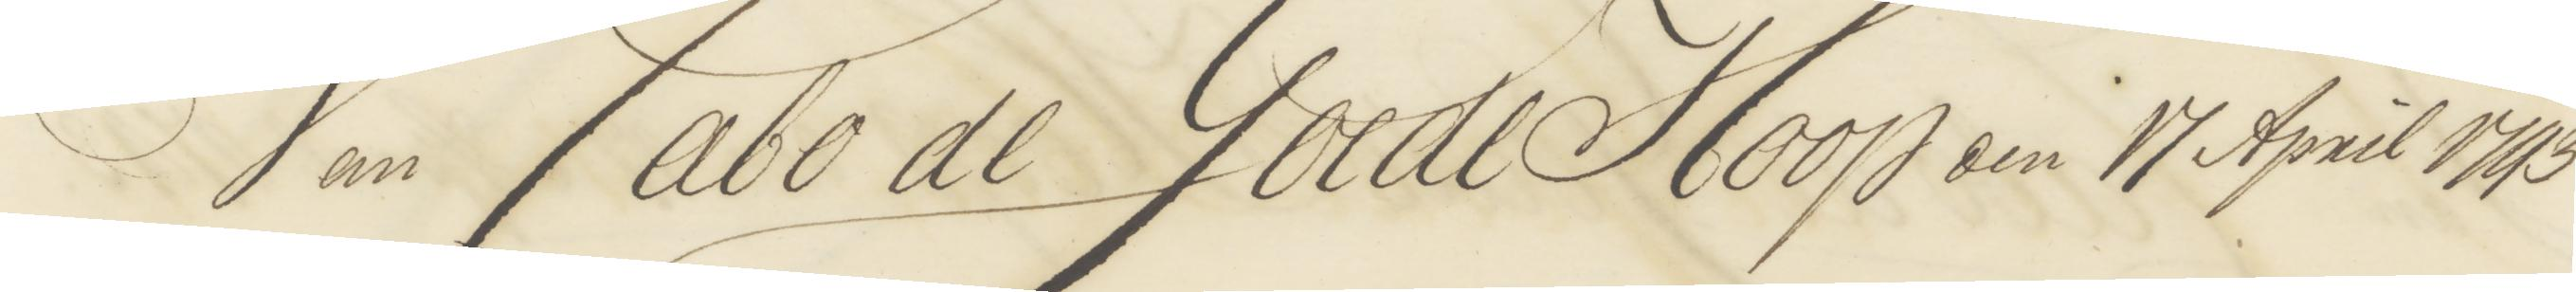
Van Cabo de Goede Hoop den 17 April 1743
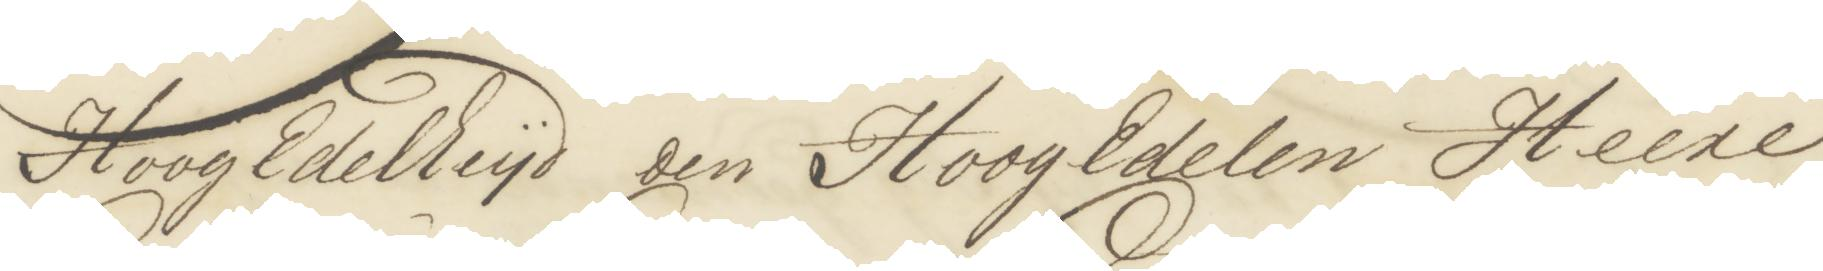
Hoog Edelheijd den Hoog Edelen Heere
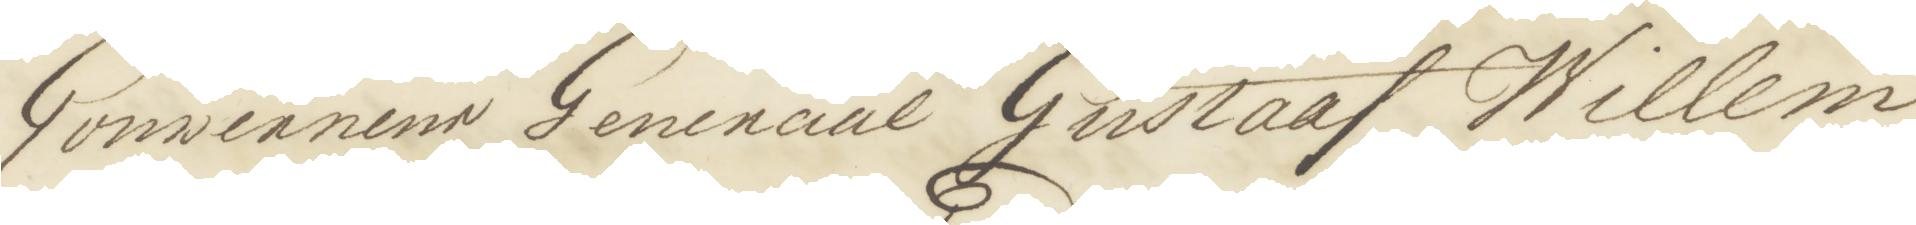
Gouverneur Generaal Gustaaf Willem
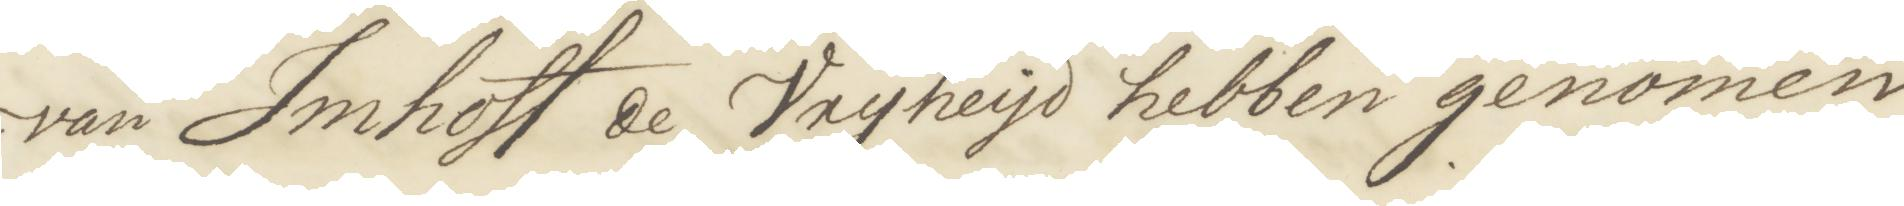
van Imhoff de Vrijheijd hebben genomen
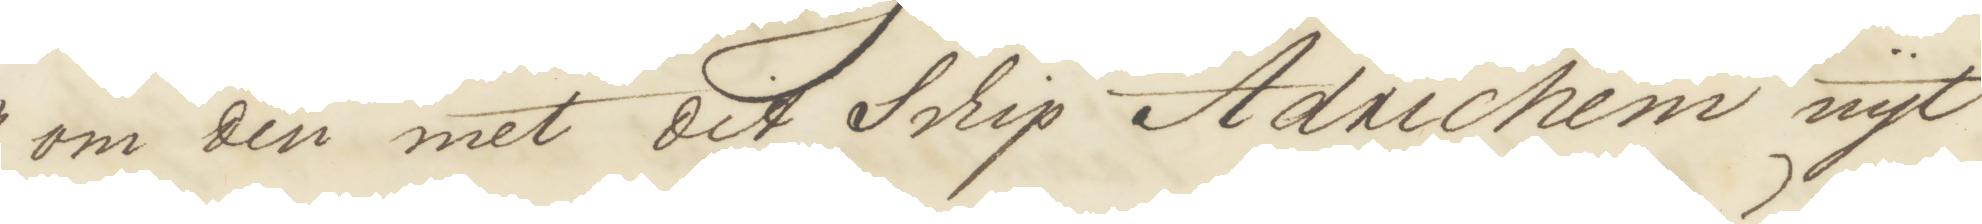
om den met dit schip Adrichem uijt
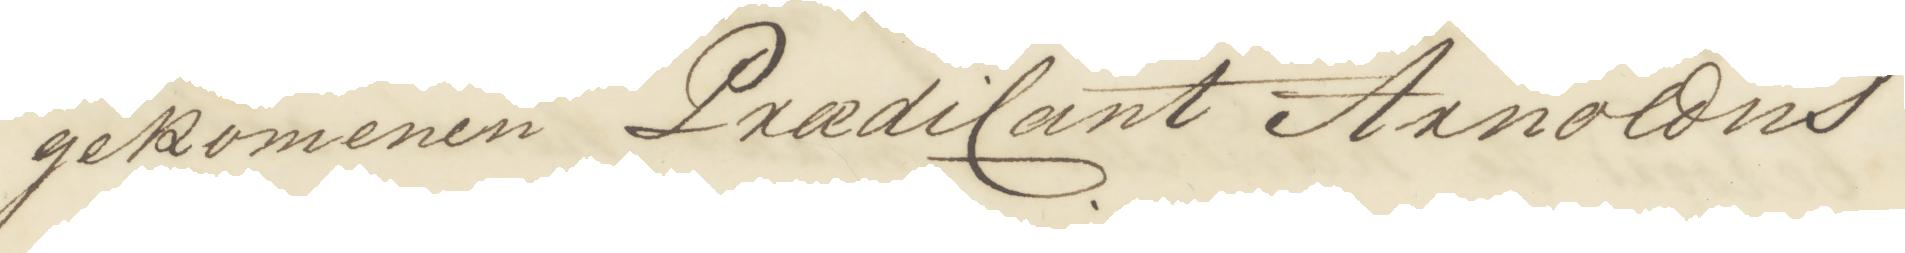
gekomenen Praedicant Arnoldus
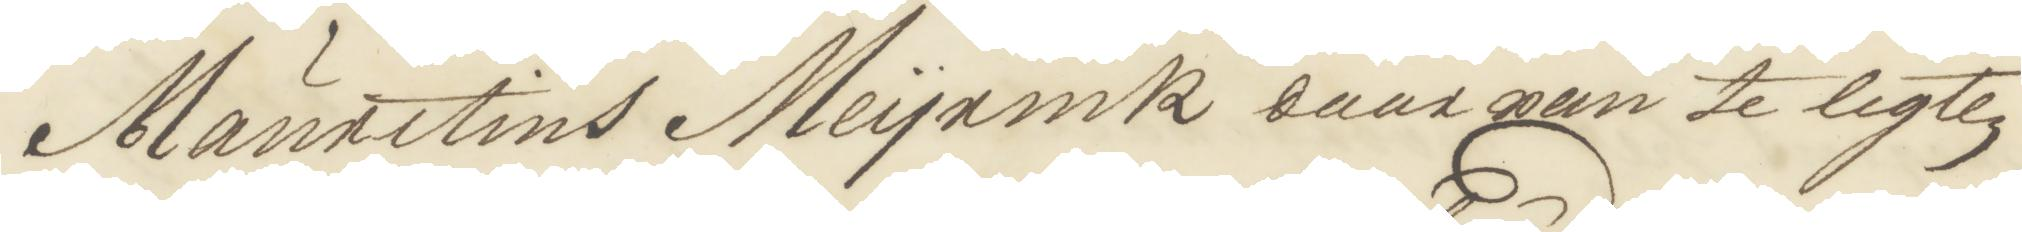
Mauritius Meijrink daar van te ligten
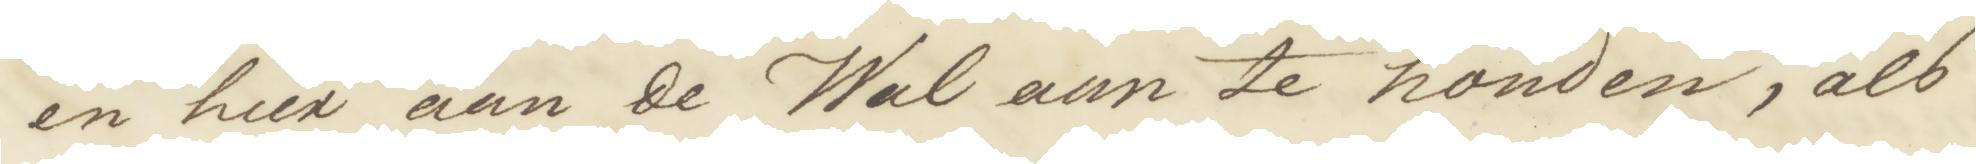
en hier aan de wal aan te houden, als
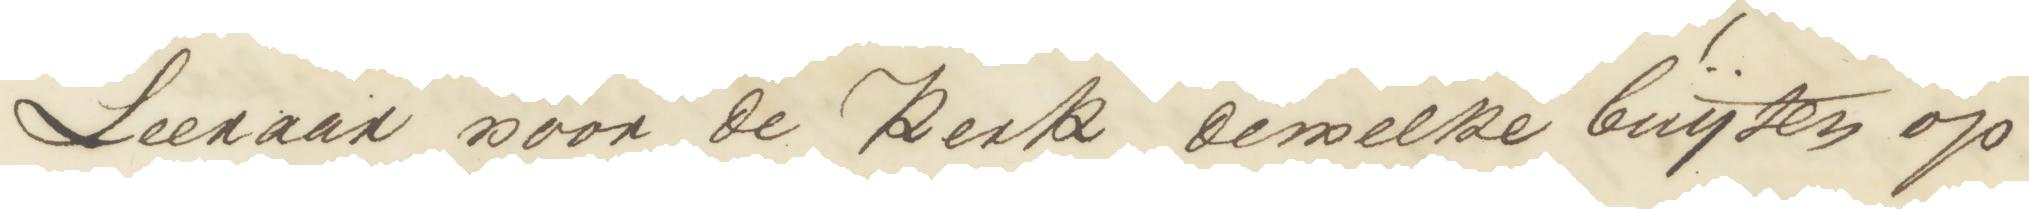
Leeraar voor de Kerk dewelke buijten op
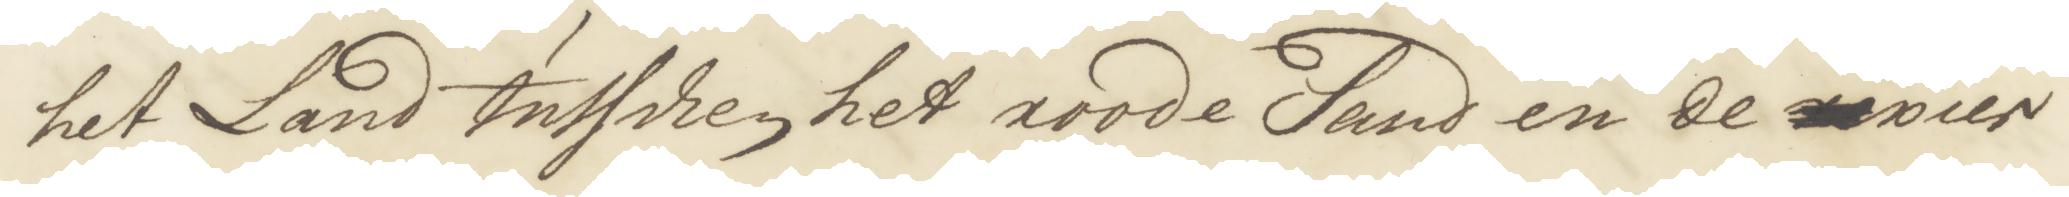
het Land tusschen het roode sand en de revier
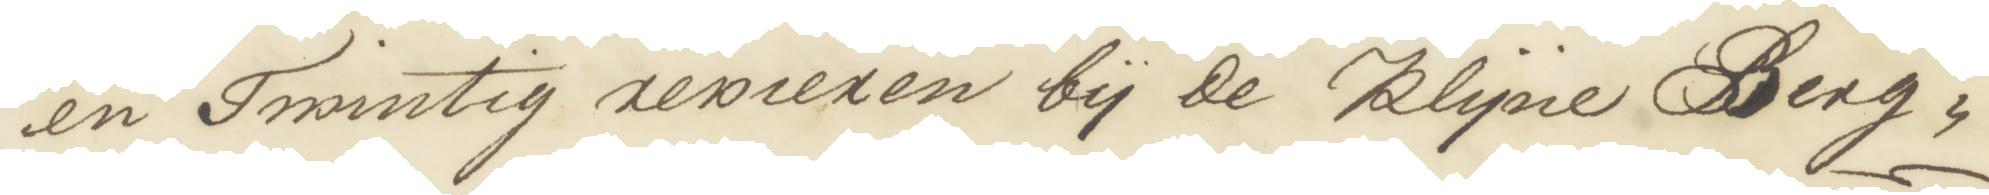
en Twintig revieren bij de klijne Berg„
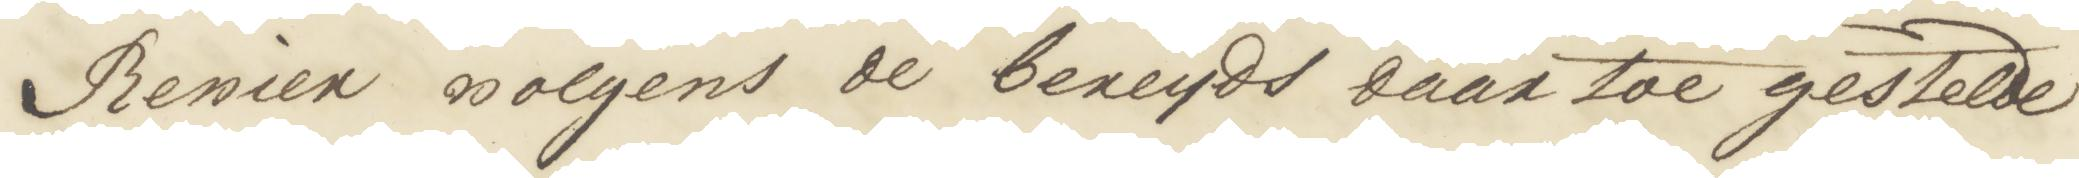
Revier volgens de bereijds daar toe gestelde
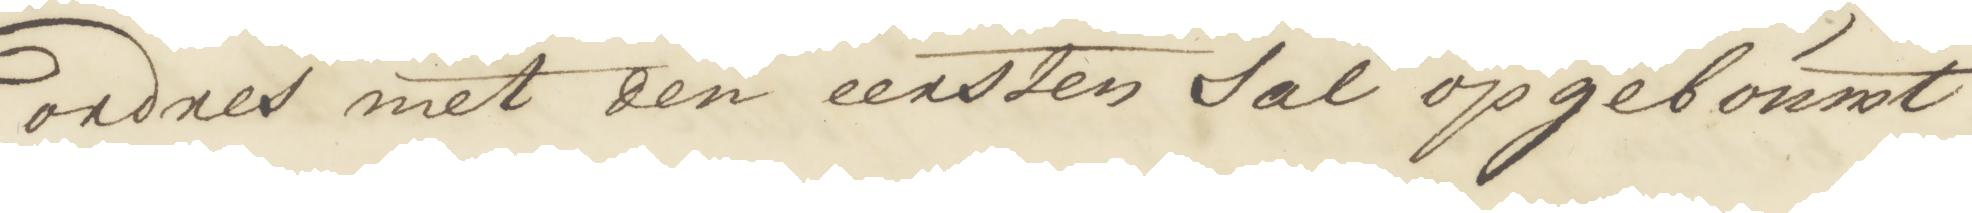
ordres met den eersten sal opgebouwt
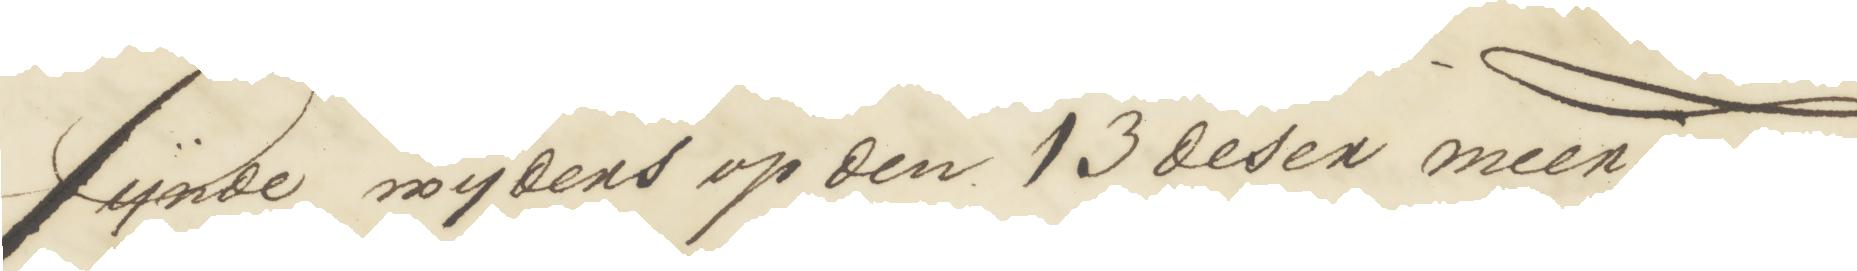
Sijnde wijders op den 13 deser meer gem
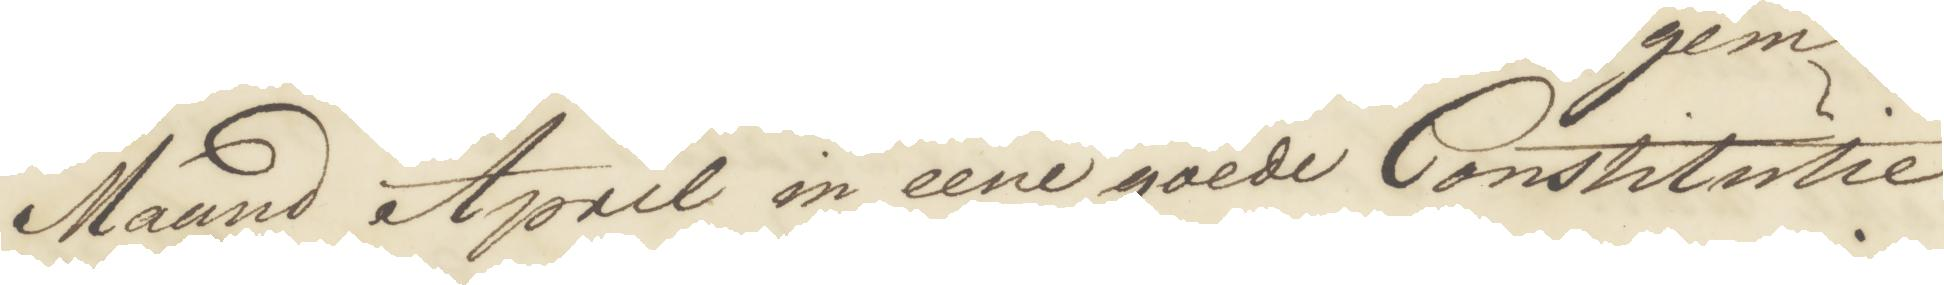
Maand April in eene goede Constitutie
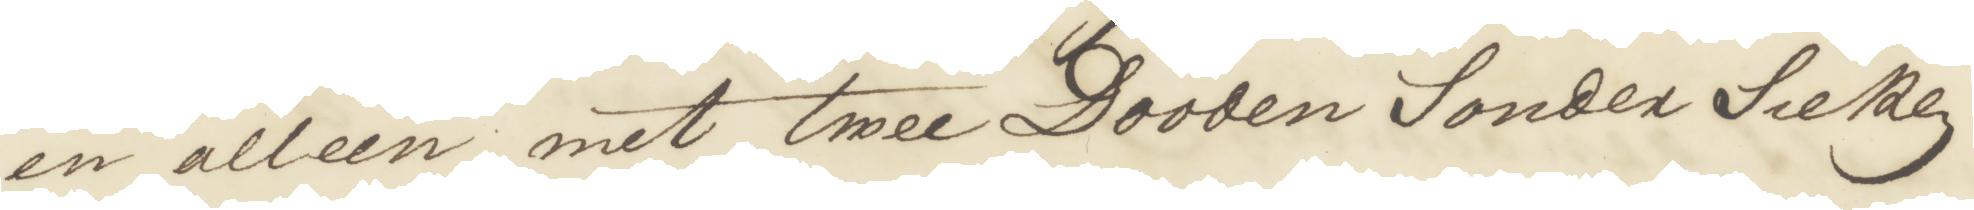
en alleen met twee Dooden sonder sieken
